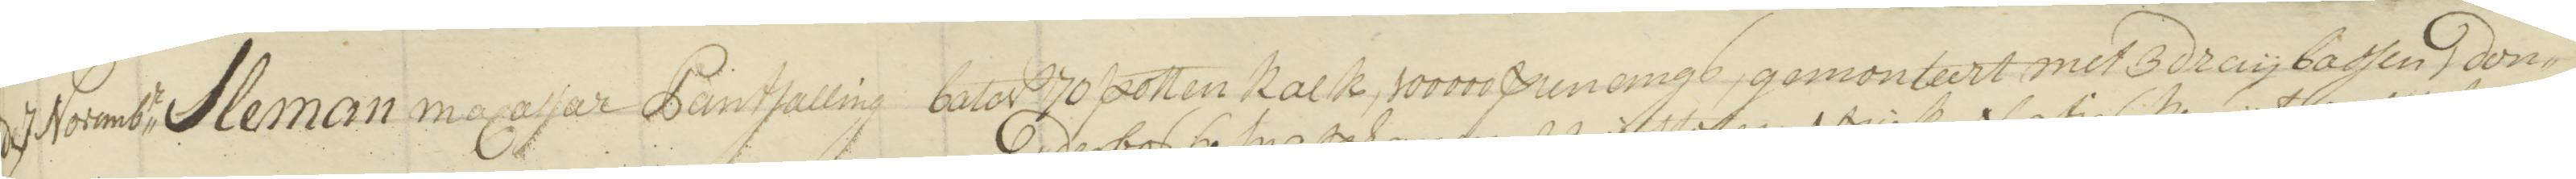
den 7 Novemb„r Sleman macassar Pantjalling batav 70 potten kalk, 100000 pienangs, gemonteert met 3 draijbassen, don„
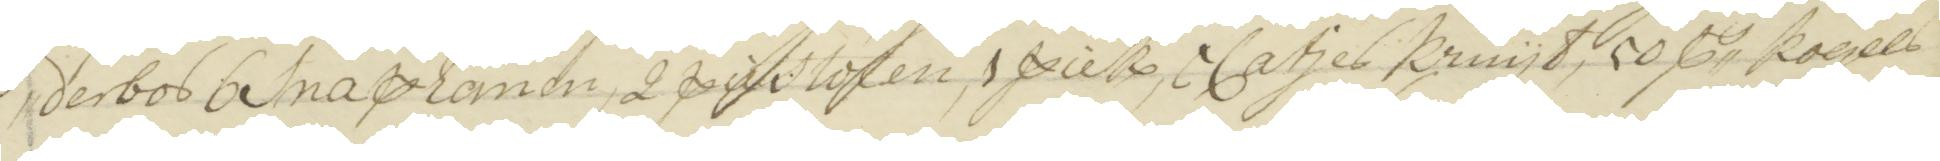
„derbos 6 snaphanen, 2 piestolen, 1 piek, 5 Catjes kruijt, 50 p„s kogels
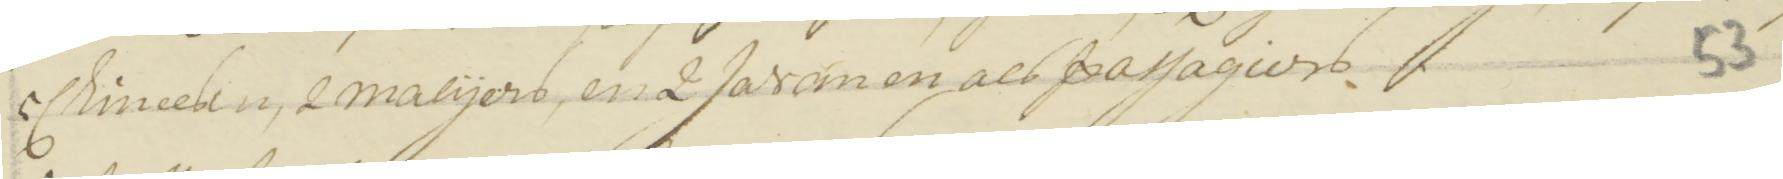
5 Chineesen, 2 malijers, en 2 Javanen als passagiers 53
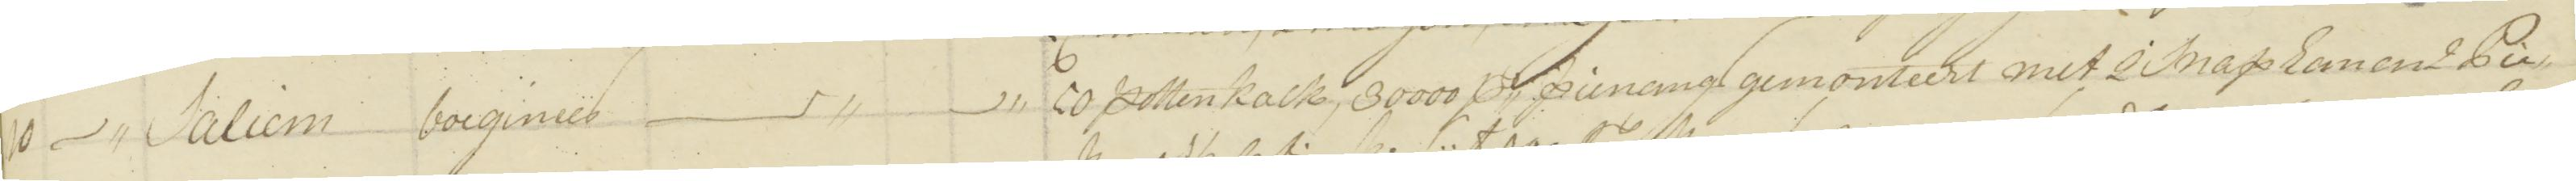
10 _„ Saliem boeginees _„ _„ 50 pottenkalk, 30000 p„s pienangs gemonteert met 2 snaphanen 2 Pie„
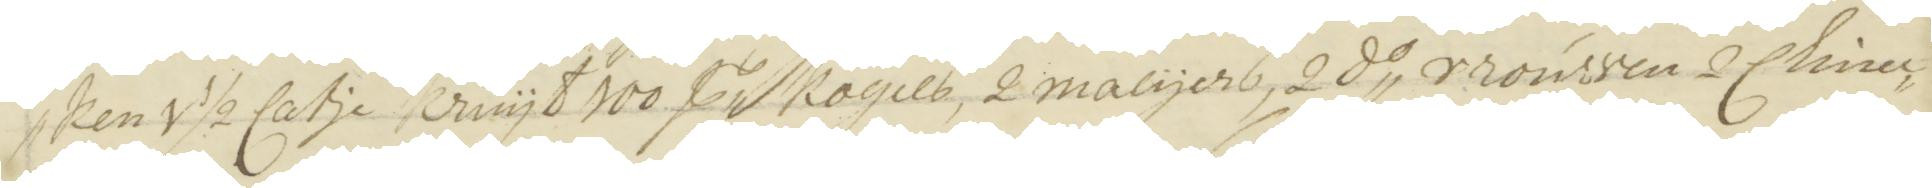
„ken 1½ Catje kruijt 100 p„s kogels, 2 malijers, 2 d„o vrouwen 2 Chinee„
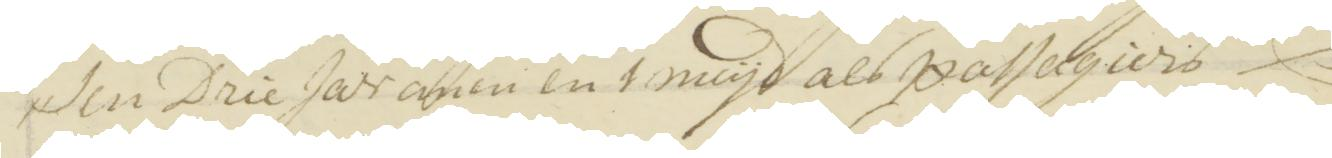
„sen Drie Javanen en 1 meijd als passagiers
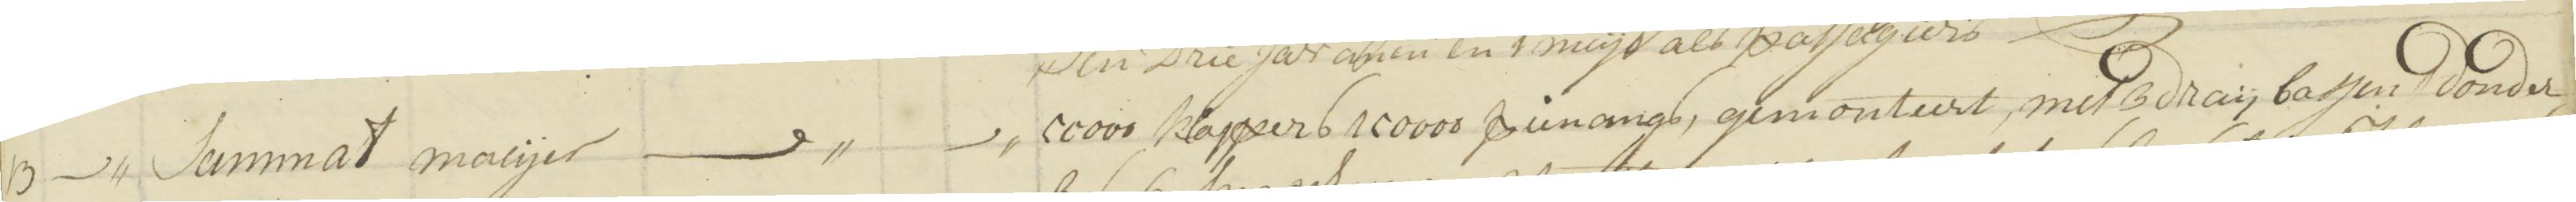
13 _„ Sammat malijer _„ _„ 50000 klappers 150000 pienangs, gemonteert, met 3 draij bassen donder
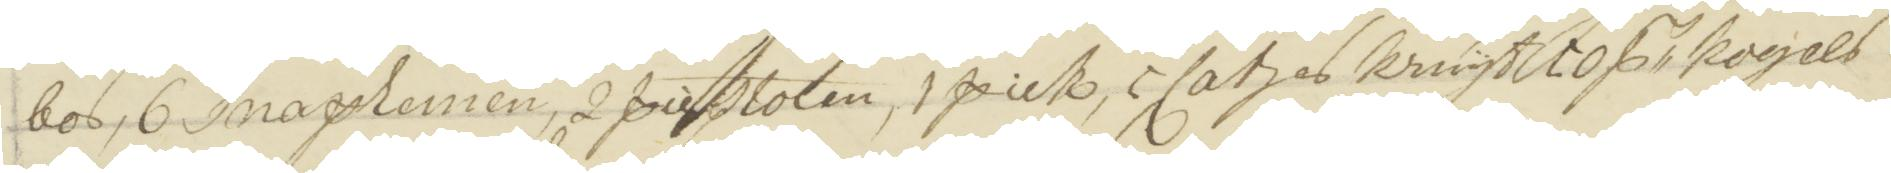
bos, 6 snaphanen, 2 piestolen, 1 piek, 5 Catjes kruijt 50 p„s kogels
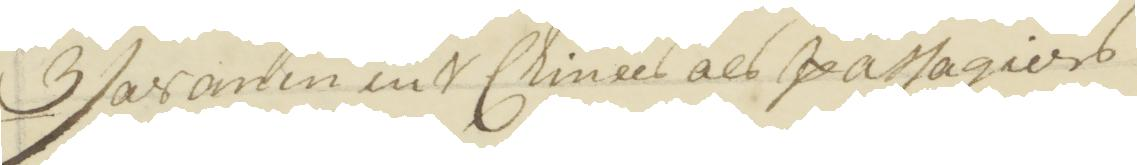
3 Javanen en 1 Chinees als passagiers
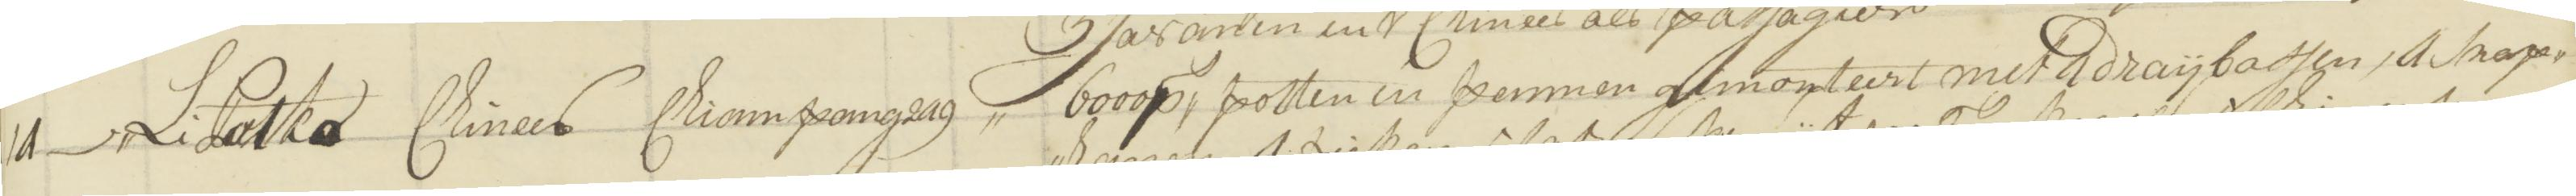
14 _„ Li Patka Chinees Chiampang 249 „ 6000p„s potten en pannen gemonteert met 4 draijbassen, 4 snap„
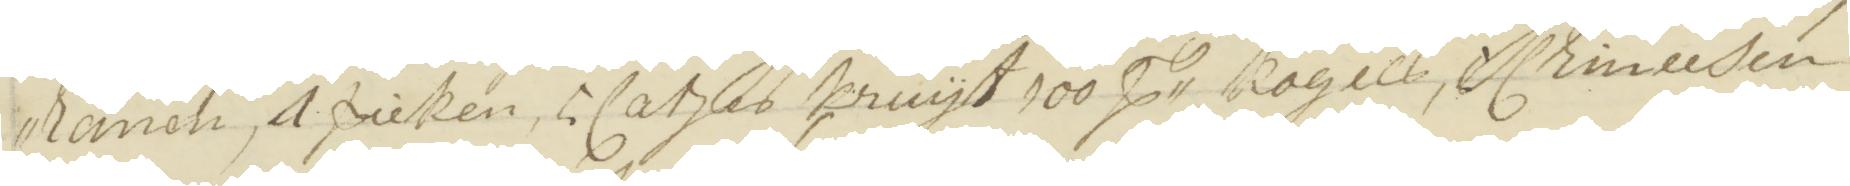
„hanen, 4: pieken, 5 Catjes kruijt 100 p„s kogels, 5 Chineesen
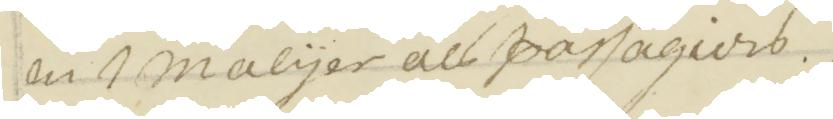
en 1 malijer als passagiers.
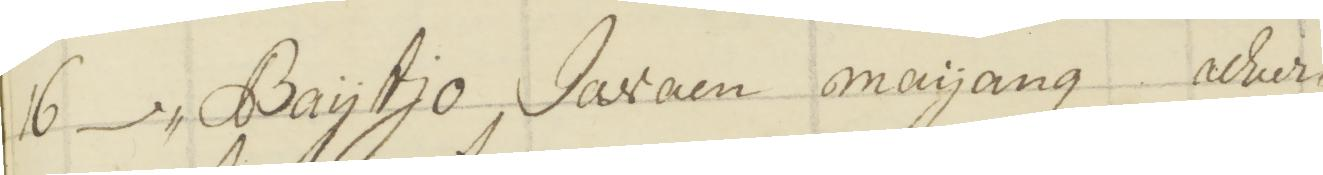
16 _„ Baijtjo, Javaen maijang alhier
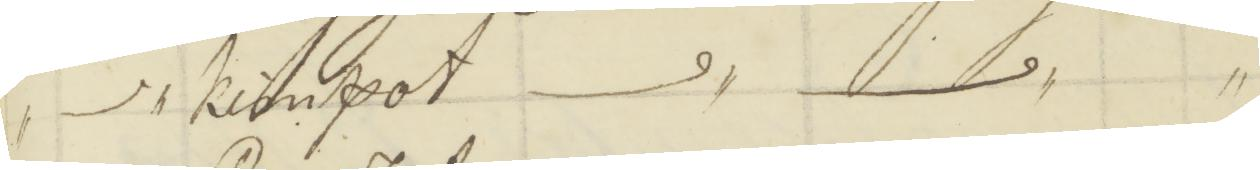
„ _„ kimpot _„ _„ „
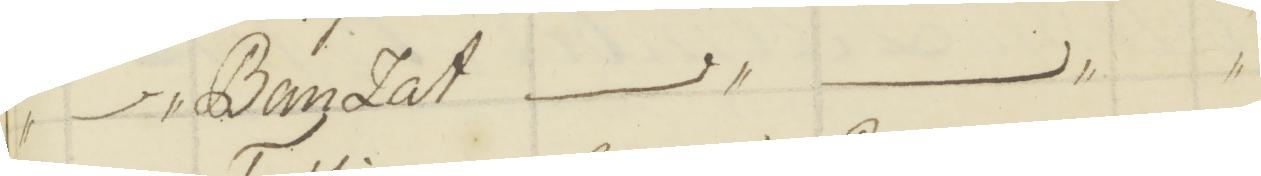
„ _„ Banzat _„ _„ „
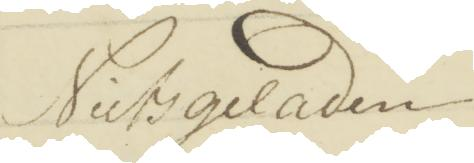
Niets geladen
